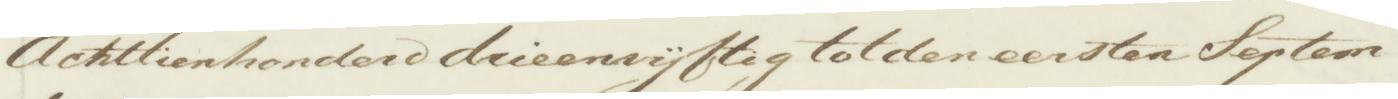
Achttienhonderd drieenvijftig tot den eersten Septem
